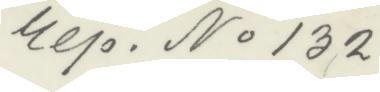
rep. No 132
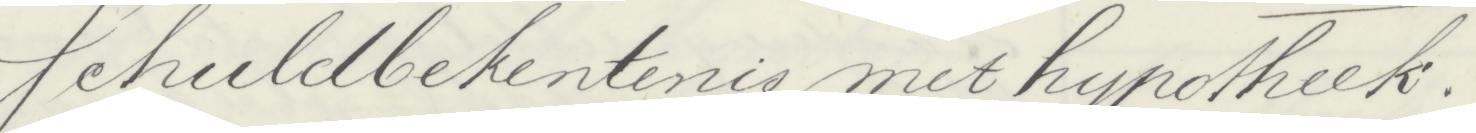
Schuldbekentenis met hypotheek.
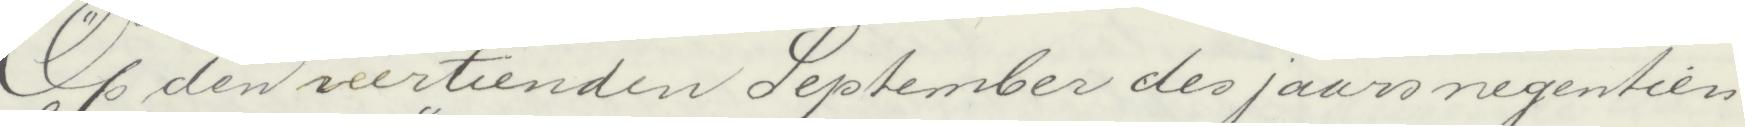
Op den veertienden September des jaars negentien
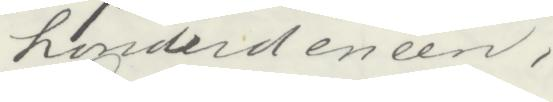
honderd en één,
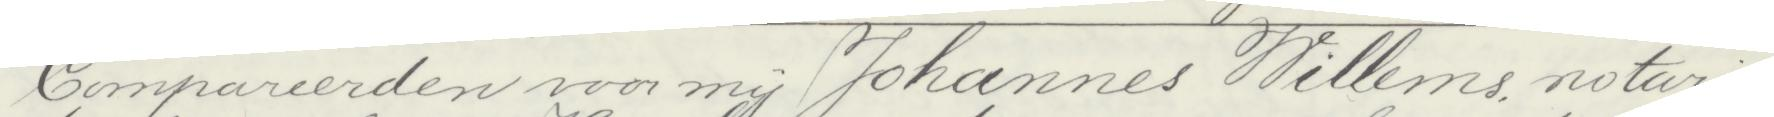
Compareerden voor mij Johannes Willems, notaris
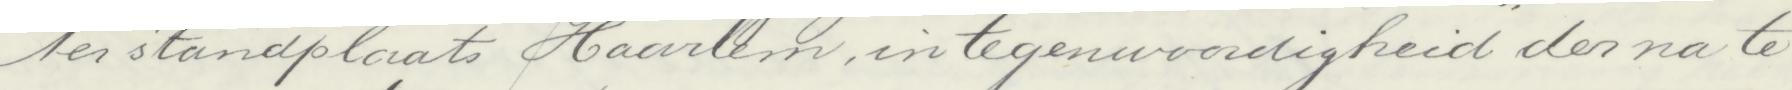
ter standplaats Haarlem, in tegenwoordigheid der na te
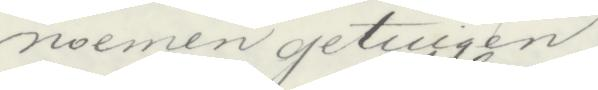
noemen getuigen
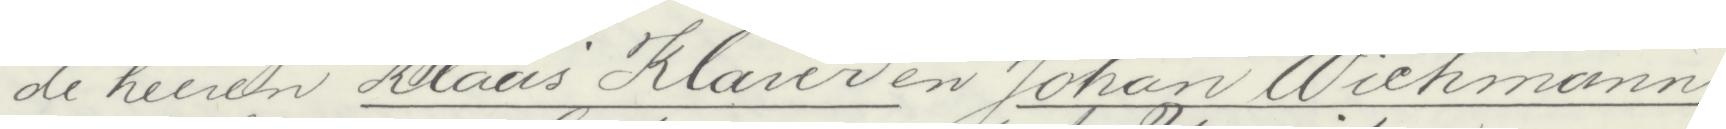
de heeren Klaas Klaver en Johan Wichmann,
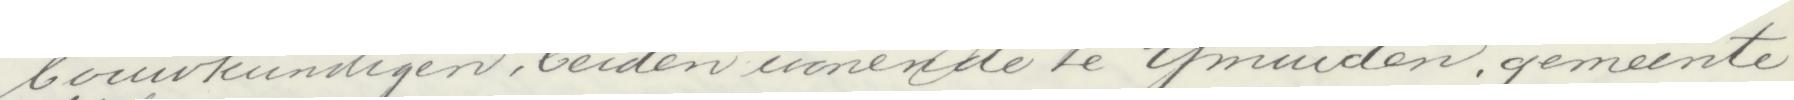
bouwkundigen, beiden wonende te Ymuiden, gemeente
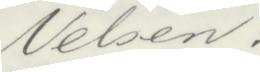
Velsen.
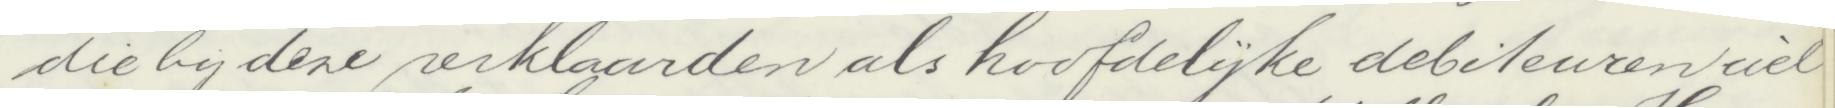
die bij deze verklaarden als hoofdelijke debiteuren wel
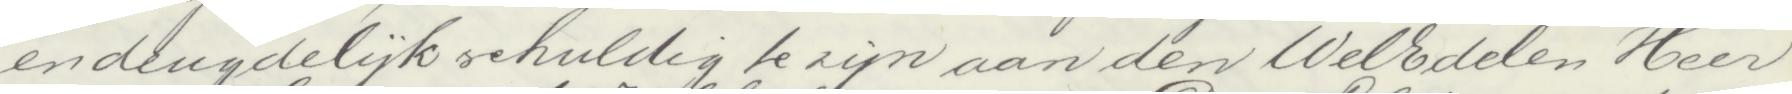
en deugdelijk schuldig te zijn aan den WelEdelen Heer
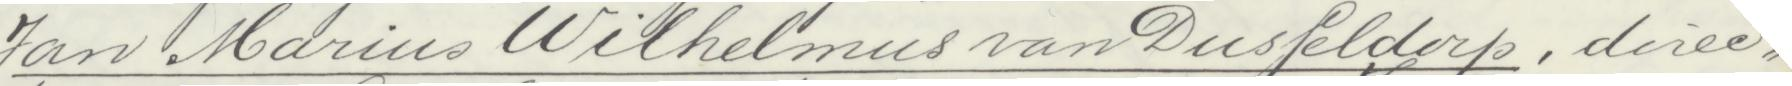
Jan Marius Wilhelmus van Dusseldorp, direc„
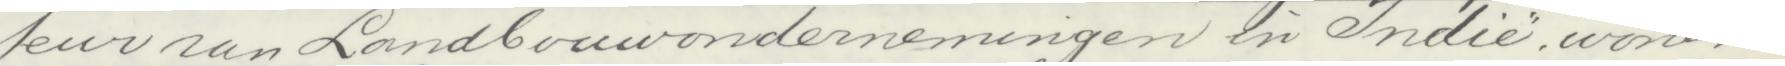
teur van Landbouwondernemingen in Indië, wonen„
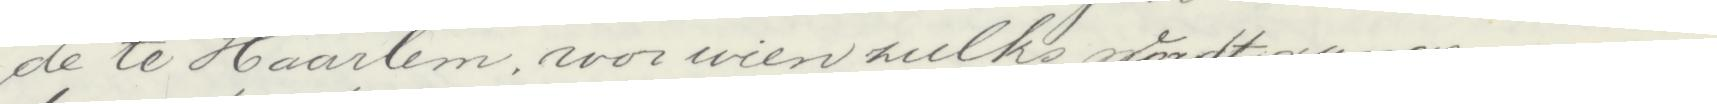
de te Haarlem, voor wien zulks wordt aangenomen
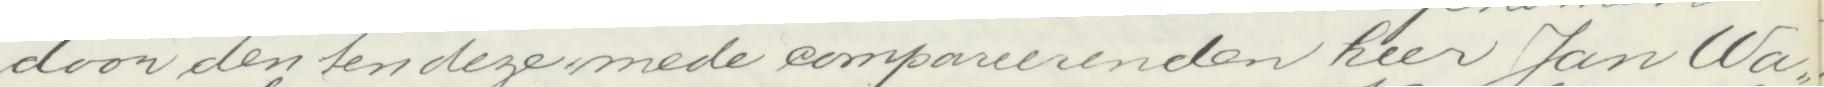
door den ten deze mede compareerenden heer Jan Wa„
